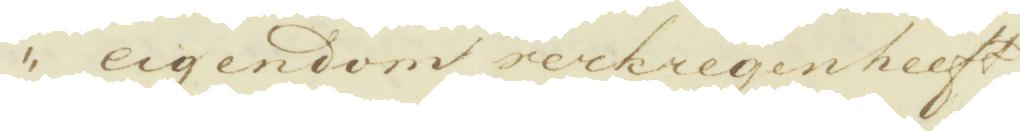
„ eigendom verkregen heeft
